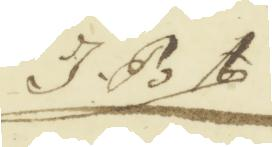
I. B A
